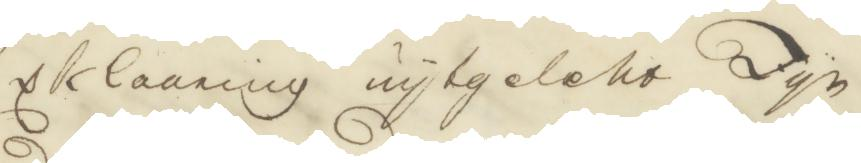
verklaaring uijtgelekt zijn
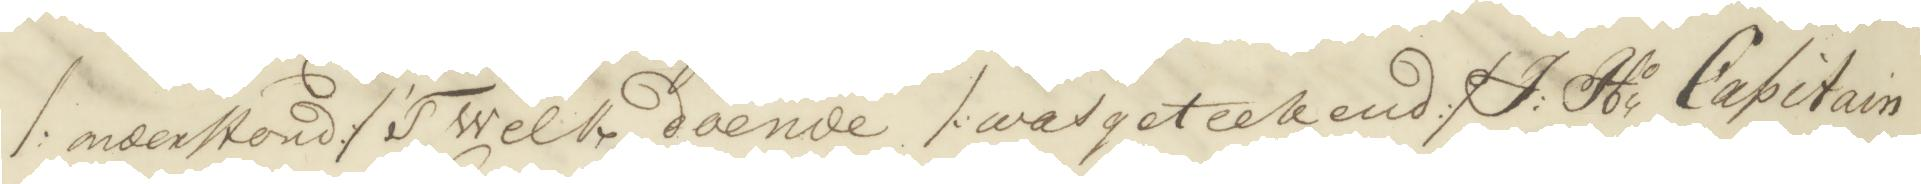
/:onderstond:/ 'T welk doende /:was geteekend:/ J: H„o Capitain
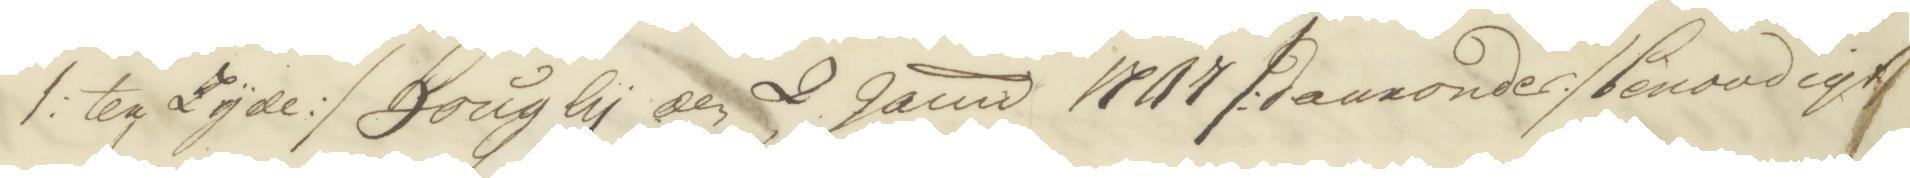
/:ter zijde:/ Houglij den 2 Janu 1747 /:daaronder:/ benoodigt
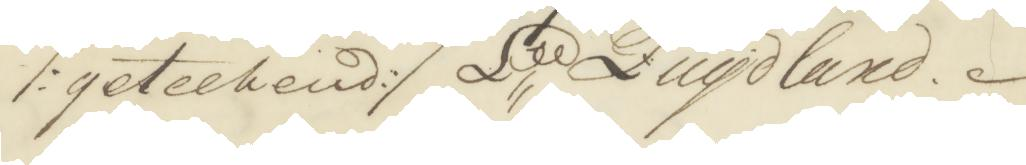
/:geteekend:/ L„ Zuijdland. _
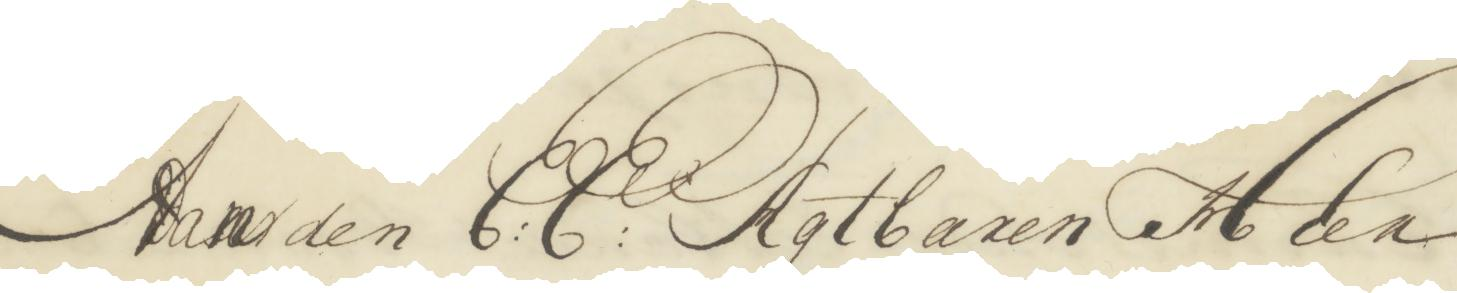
Aan den E: E: Agtbaren Heer
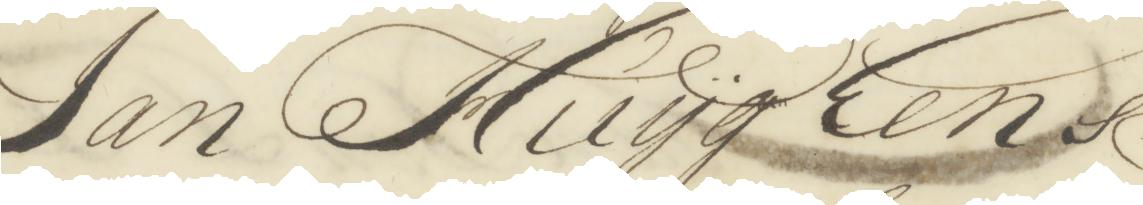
Ian Huijghens
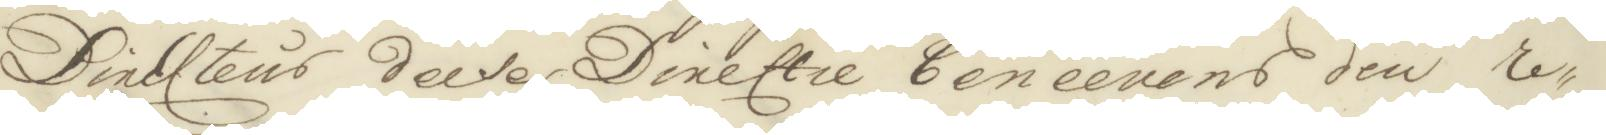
Directeur deese Directie beneevens den re„
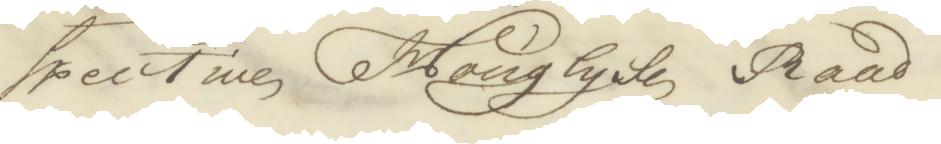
specitiven Houglysen Raad
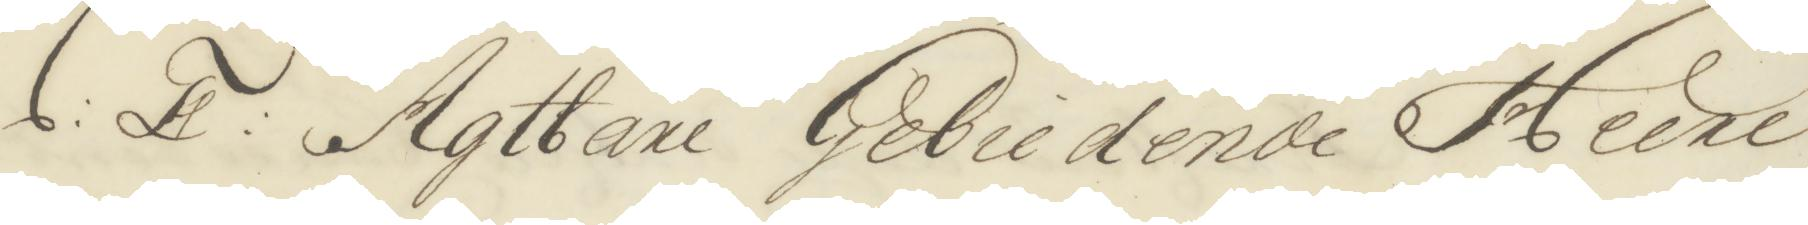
E: H: Agtbare Gebiedende Heere
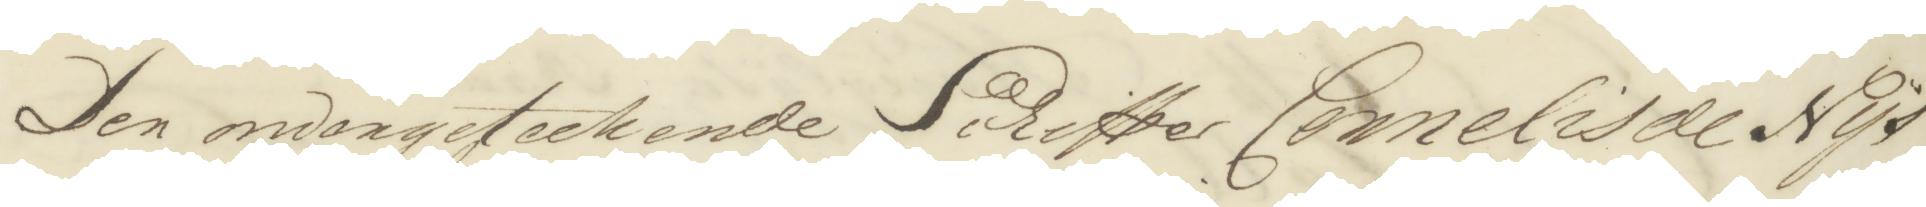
Der ondergeteekende Schipper Cornelis de Nijs
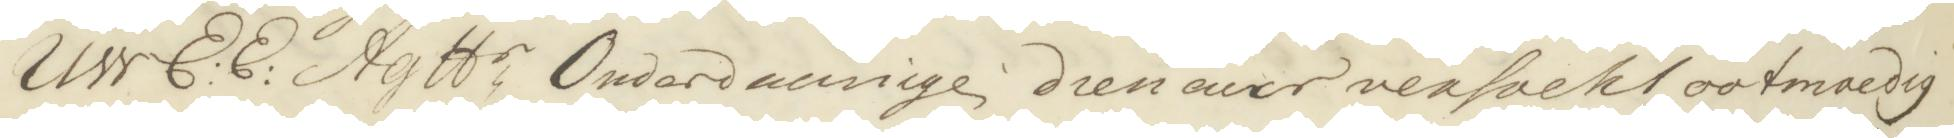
UW E: E: Agtb„s Onderdaanigen dienaar versoekt ootmoedig
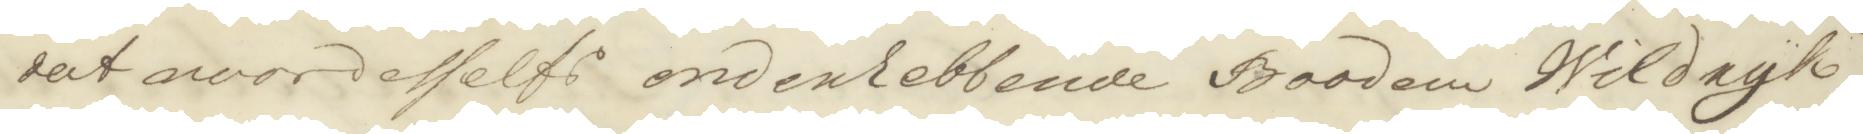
dat voor desselfs onderhebbende Boodem Wildrijk
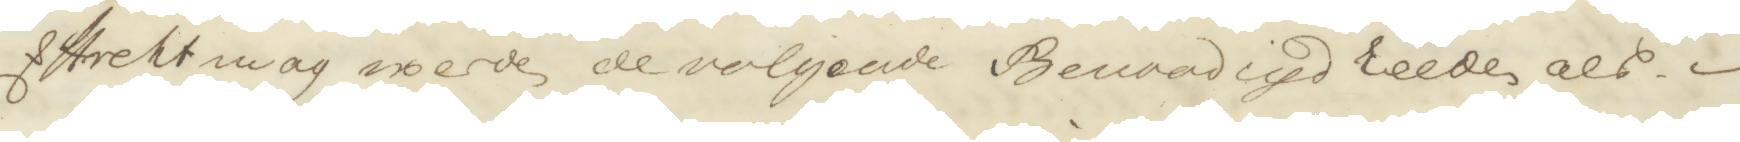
verstrekt mag werden de volgende Benoodigd heeden als. _
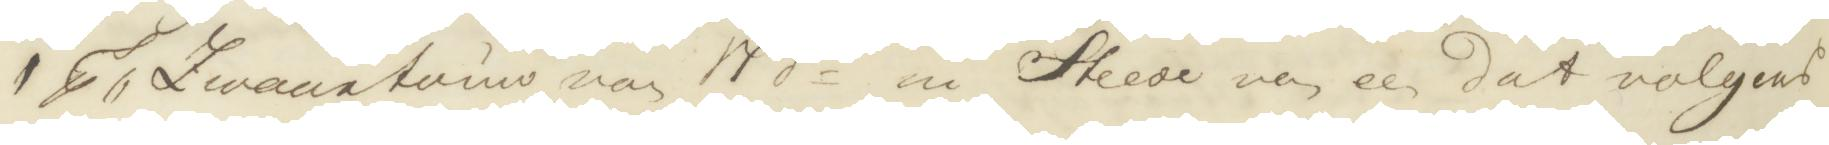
1 p„s Zwaartouw van 17 d=m in steede van een dat volgens
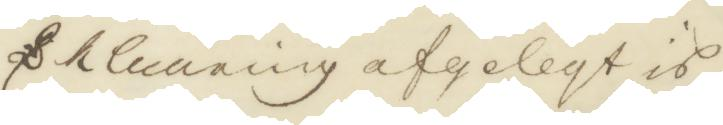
verklaaring afgelegt is
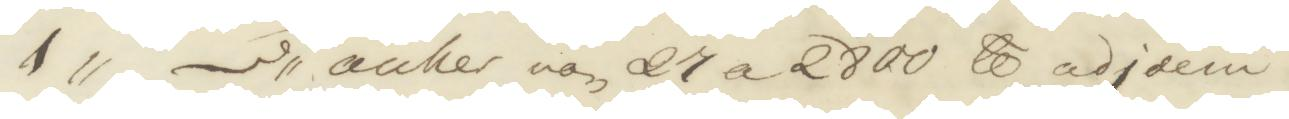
1 „ d„o anker van 27 a 2800 lb adjdem
